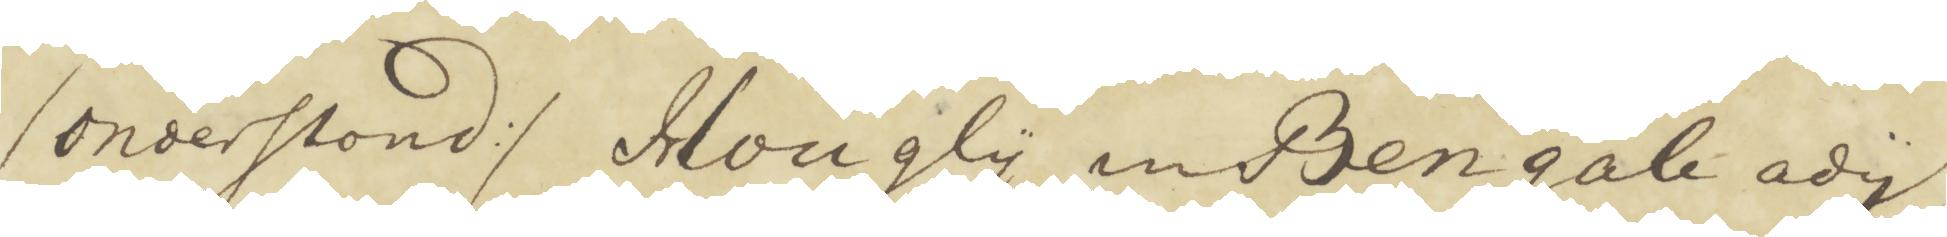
/onderstond:/ Houglij in Bengale adij
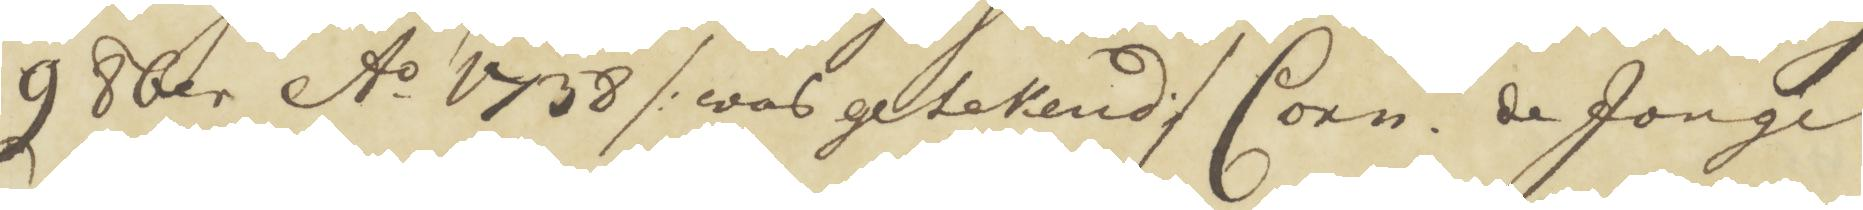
9 8ber A:o 1738 /:was getekend:/ Corn. de Jonge
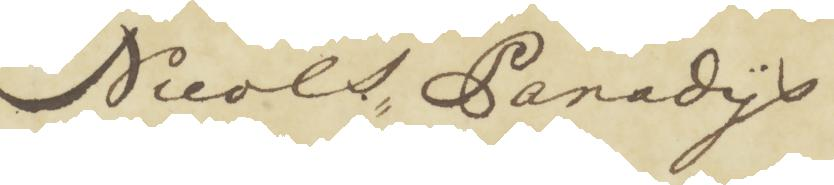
Nicol.„s Paradijs
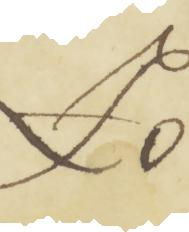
Zo
